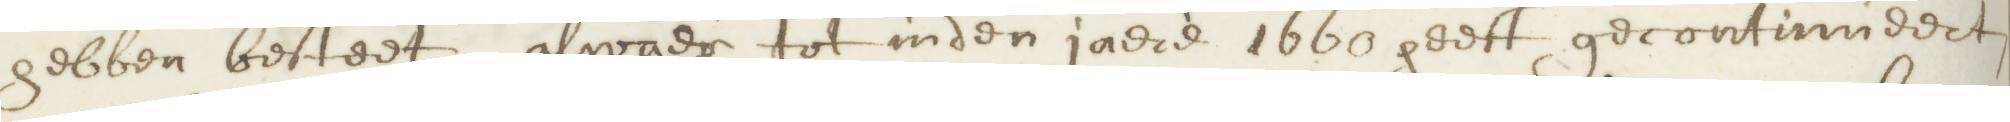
hebben besteet, alwaer tot inden jaere 1660 geeft gecontinueert
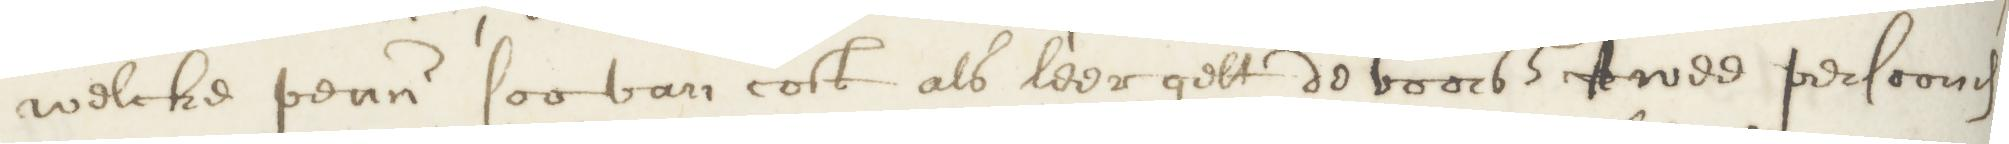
welcke penn soo van cost als leer gelt de voorsz twee persoonen
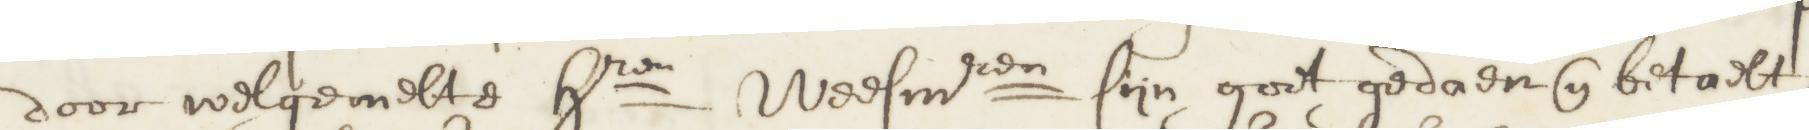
door welgemelte h=ren Weesm=ren sijn goet gedaen ende betaelt
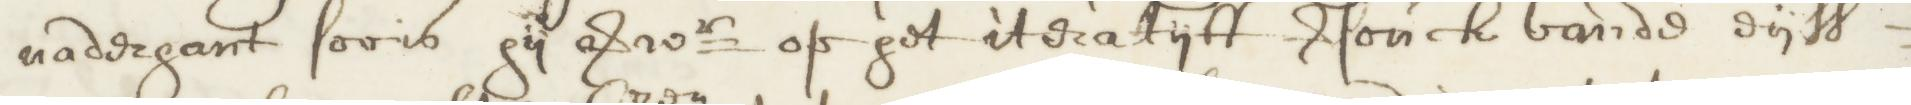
naderhant soo is hij verw=r op het iteratijff versouck vande eijss=re
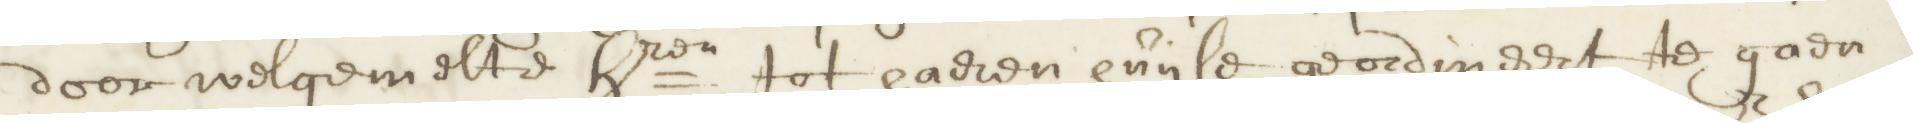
door welgemelte h=ren tot haeren huijse geordineert te gaen
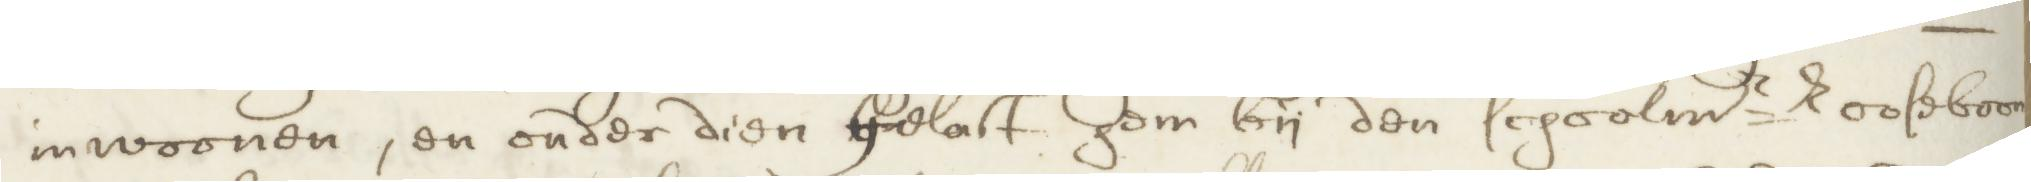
inwoonen, en onder dien gelast hem bij den schoolm=r rooseboom
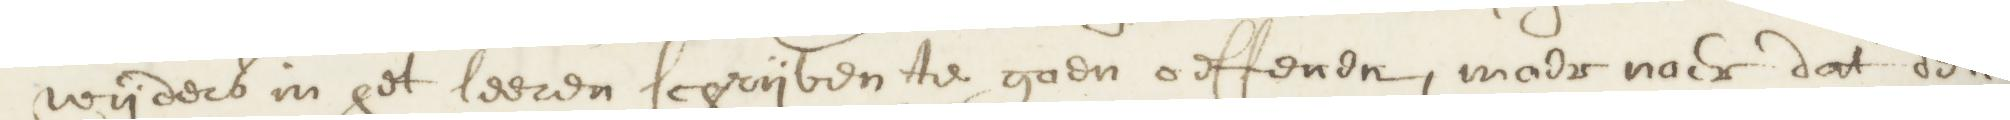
wijders in het leeren schrijven te gaen oeffenen, maer naer dat den
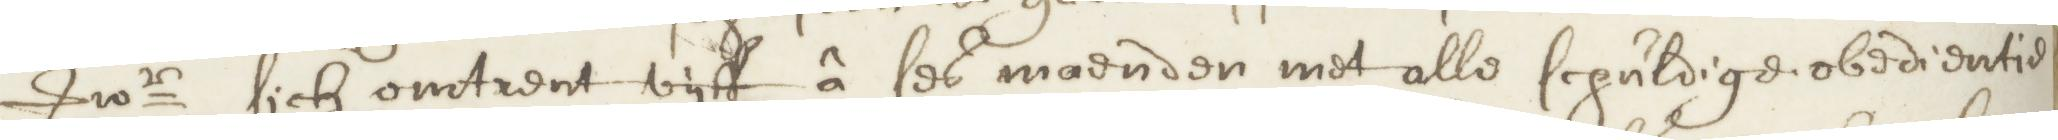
verw=r sich omtrent vijff â ses maenden met alle schuldige obedientije
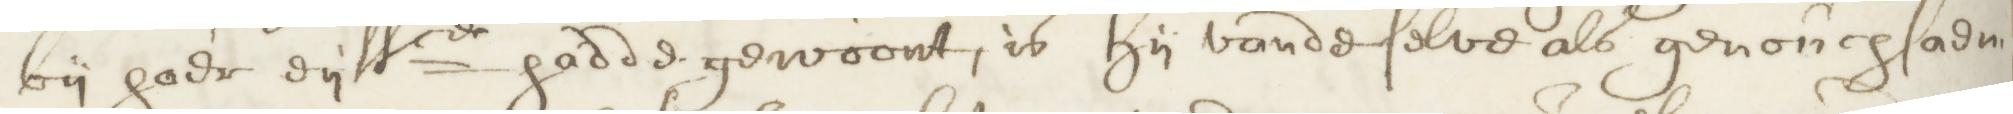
bij haer eijss=ce hadde gewoont, is hij van de selve als genouchsaem
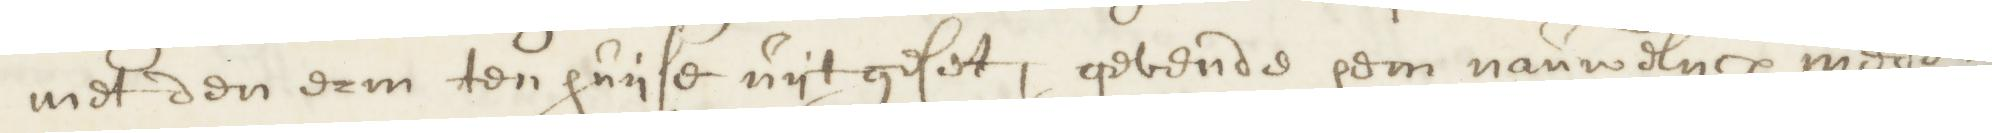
met den erm ten huijse uijtgeset, gevende hem nauwelycx mede
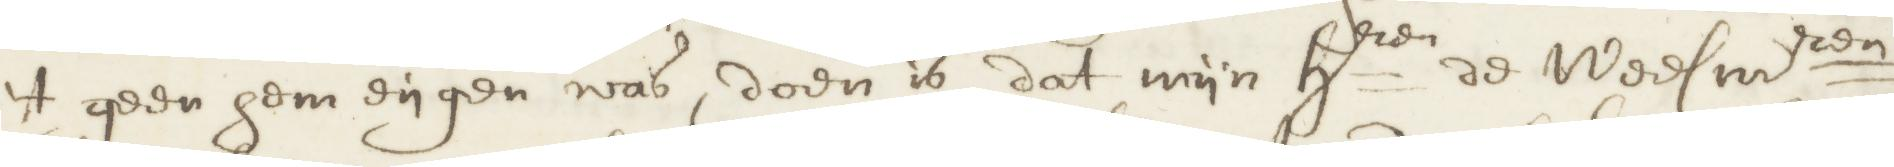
't geen hem eijgen was, doen is dat mijn h=ren de Weesm=ren
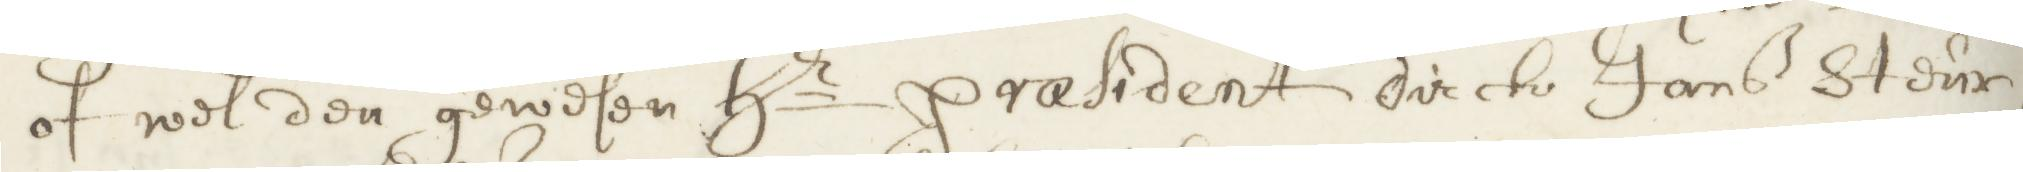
of wel den gewesen h=r praesident dirck Jans steur
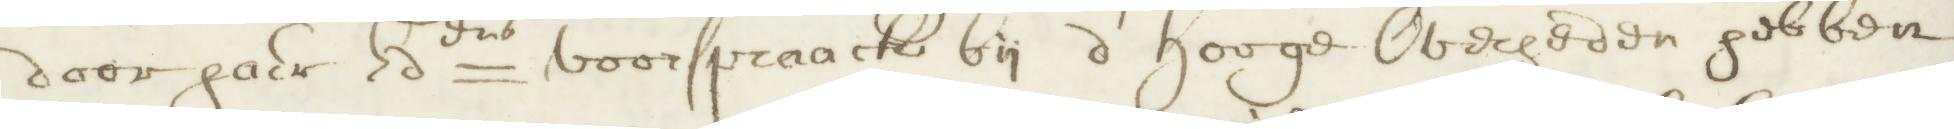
door haer Ed=ens voorspraack bij d’ hooge Overheden hebben
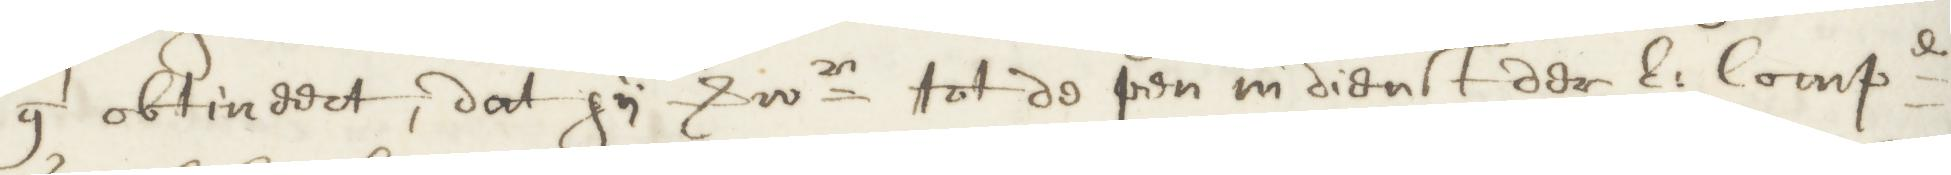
g’ obtineert, dat hij verw=r tot de pen in dienst der E: Comp=e
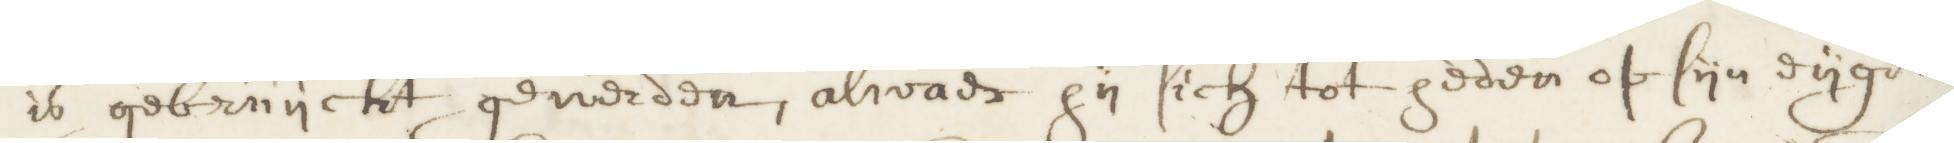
is gebruijckt gewerden, alwaer hij sich tot heden op sijn eijgen
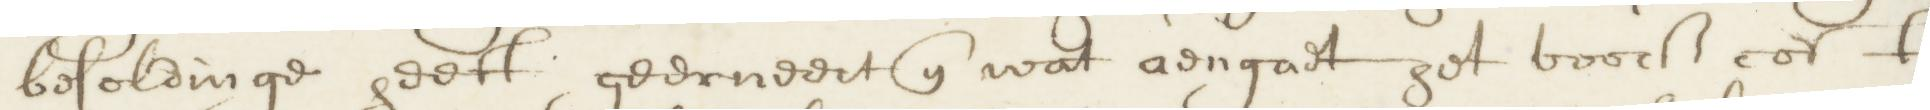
besoldinge heeft geerneert ende wat aengaet het voorst cost
